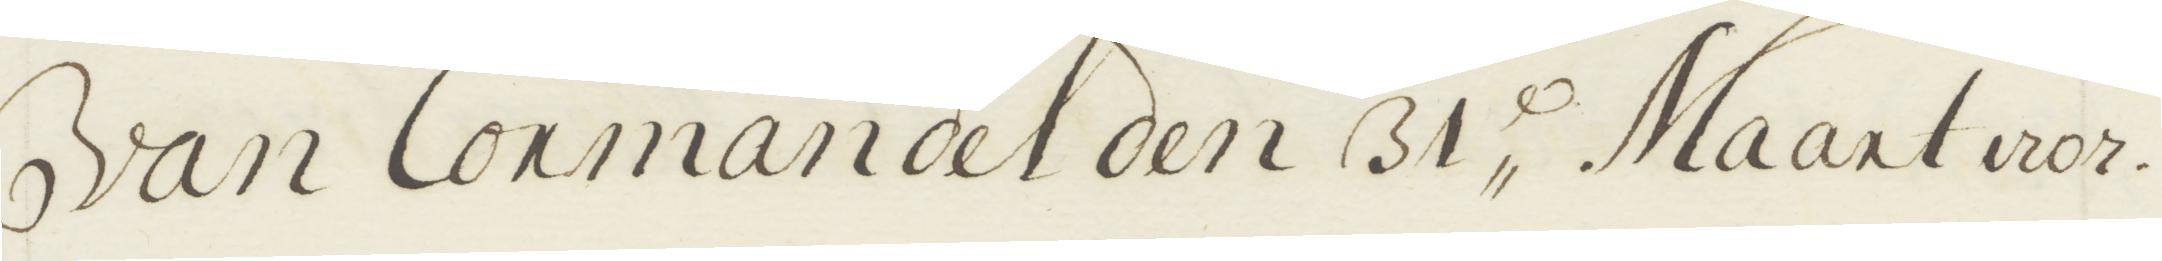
Van Cormandel den 31„e Maart 1707.
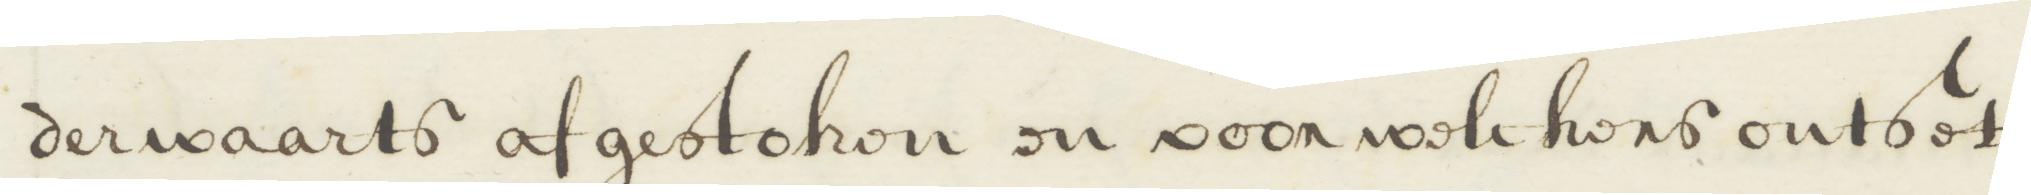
derwaarts afgestoken en voor welckers ontset
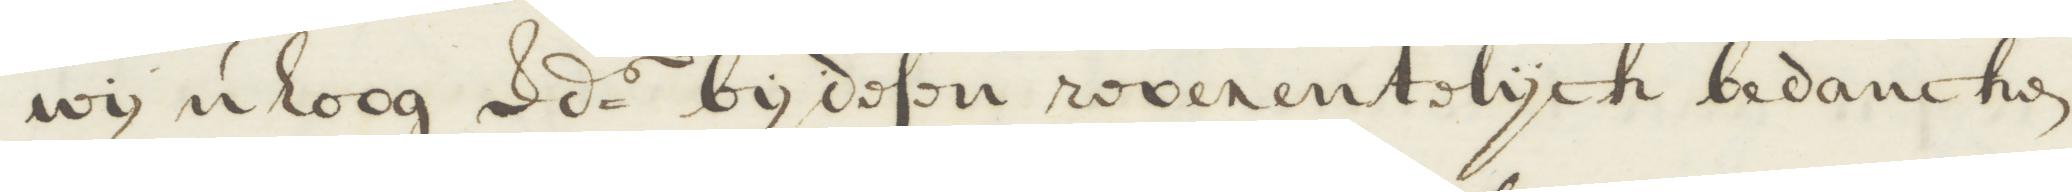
wij u hoog Ed=s bij desen reverentelijck bedancken
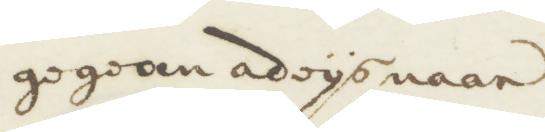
gegeven advijs naar
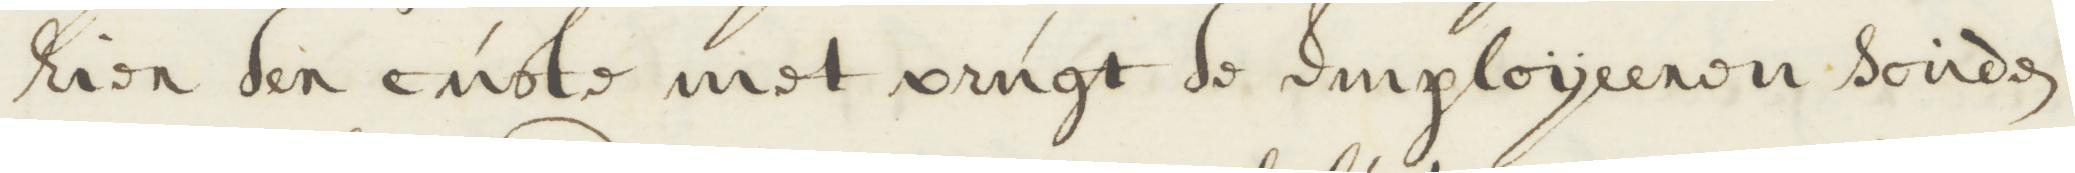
hier ter custe met vrugt te Emploijeeren souden
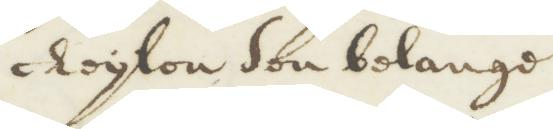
cheijlon ten belange
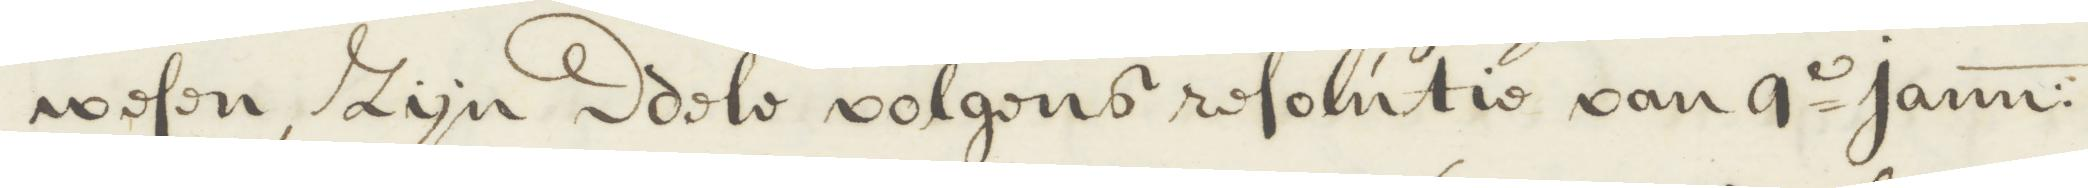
wesen, zijn Edele volgens resolutie van 4=e Jann:
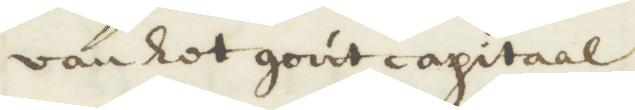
van het gout capitaal
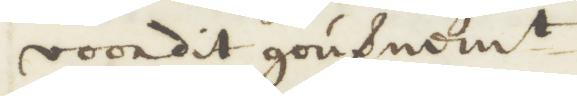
voor dit gouvernem=t
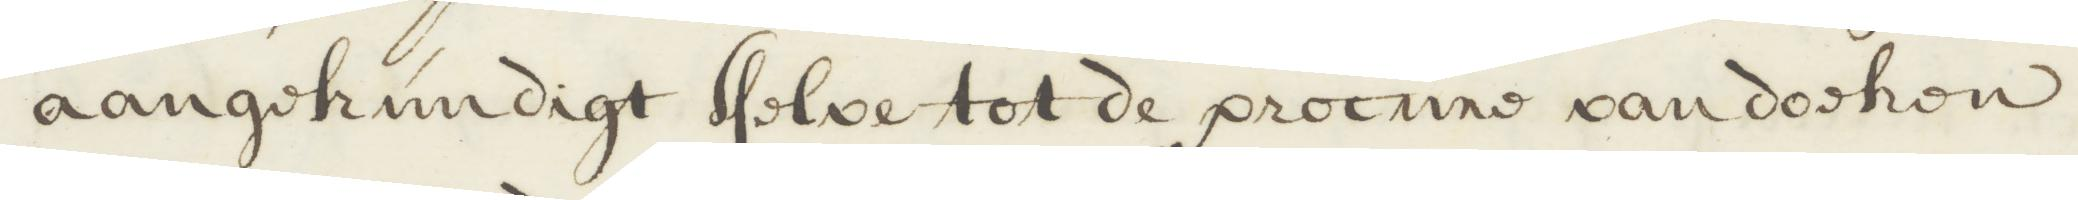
aangekundigt tselve tot de procure van doeken
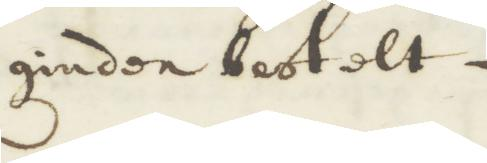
ginder bestelt
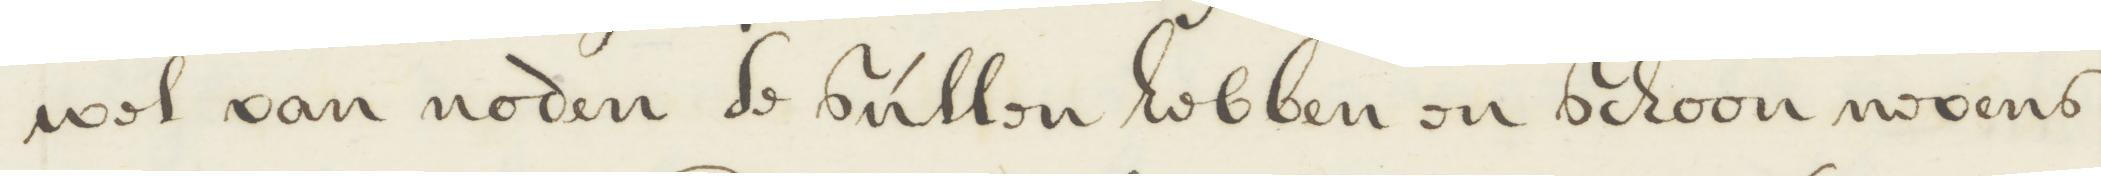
wel van noden te sullen hebben en schoon nevens
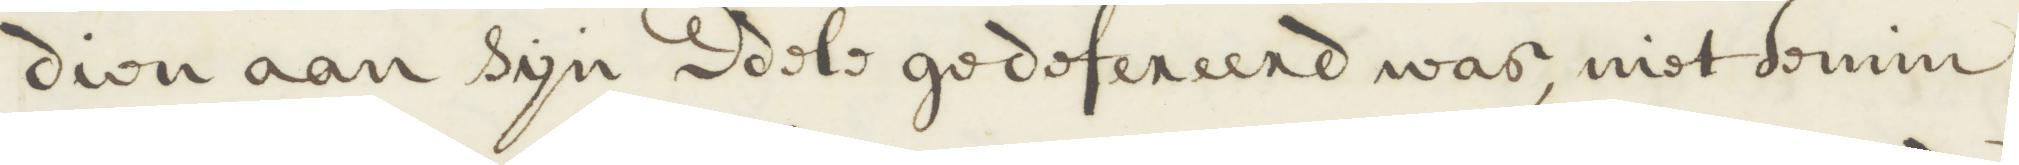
dien aan sijn Edele gedefereerd was, niet temin
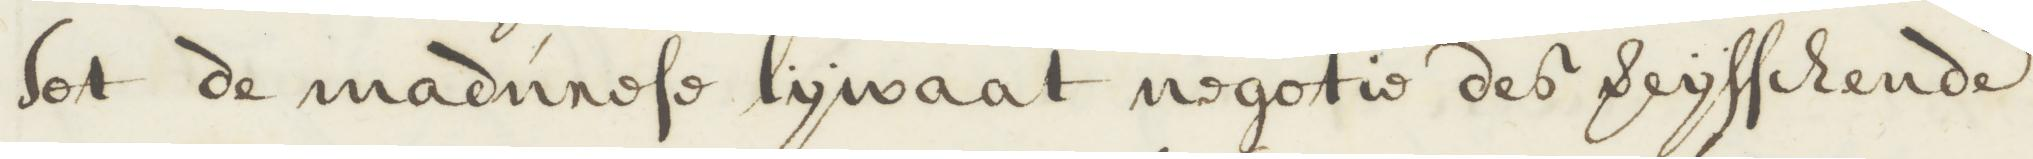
tot de madurese lijwaat negotie des vereijsschende
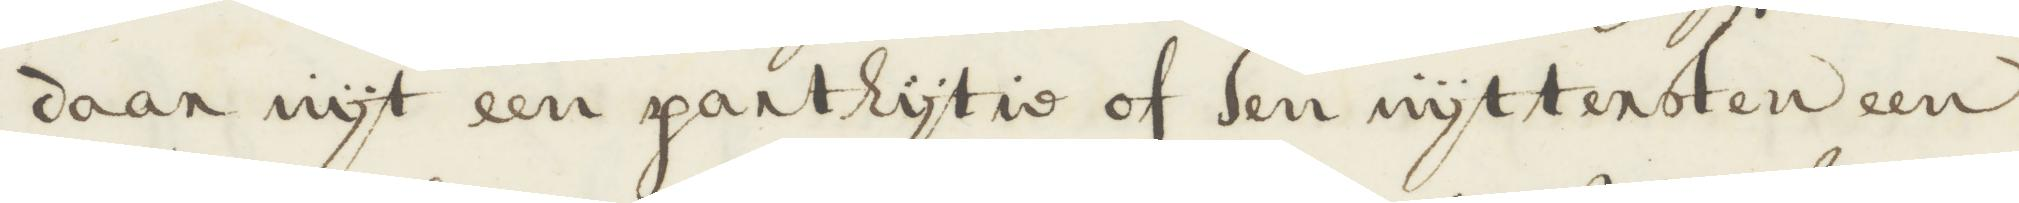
daar uijt een parthijtie of ten uijttersten een
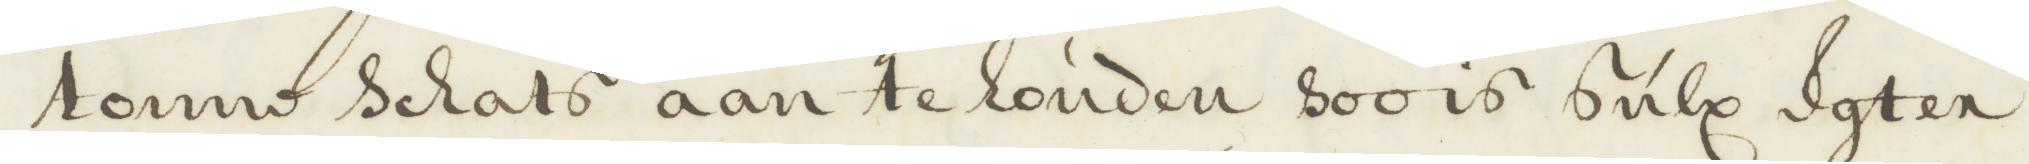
tonne schats aan te houden soo is sulx Egter
